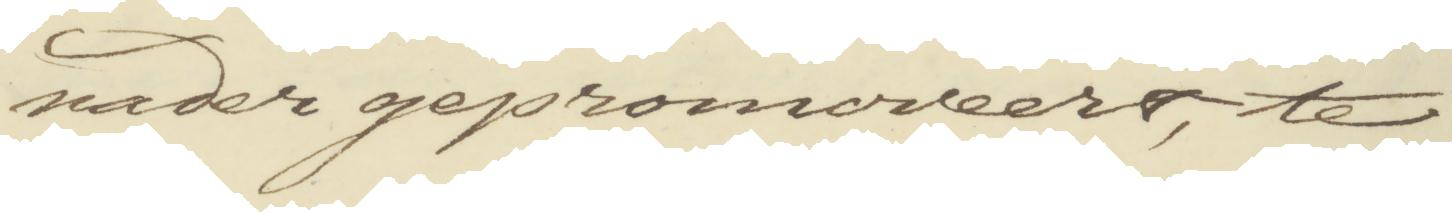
nader gepromoveert, te
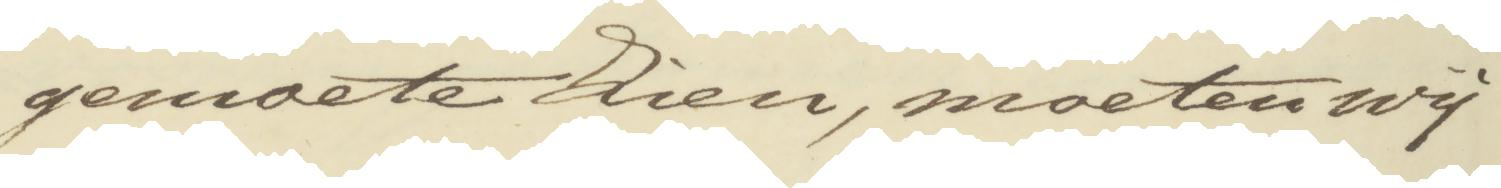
gemoete Zien, moeten wij
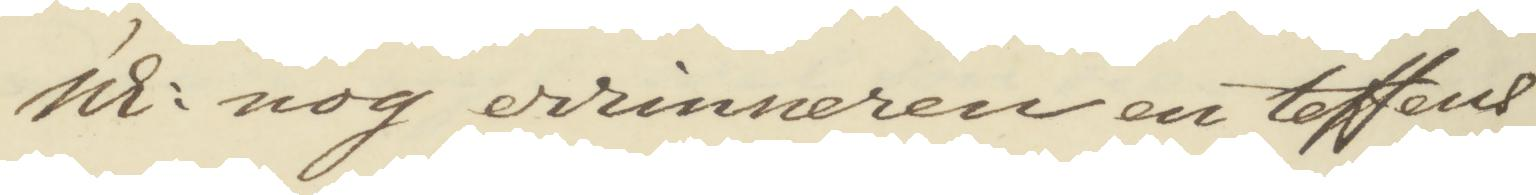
UE: nog errinneren en teffens
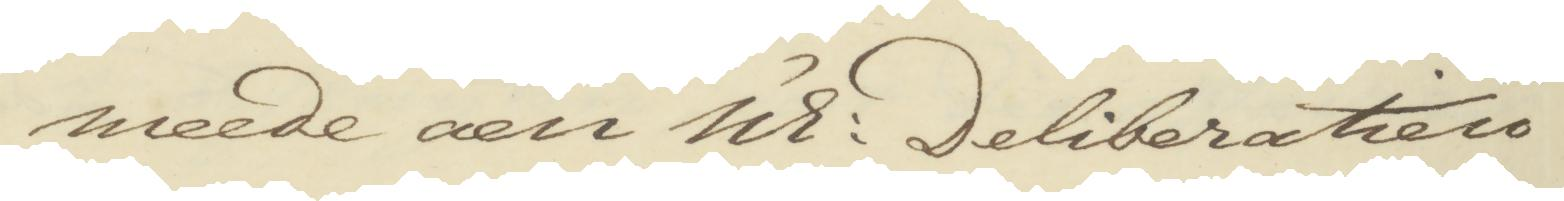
meede aen UE: Deliberatien
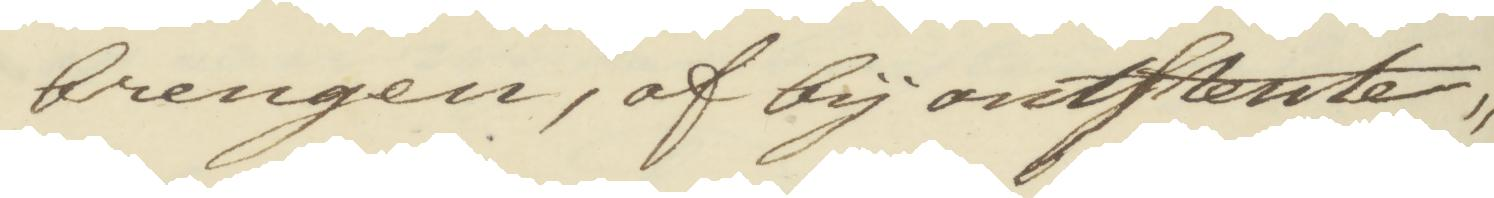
brengen, of bij ontstente„
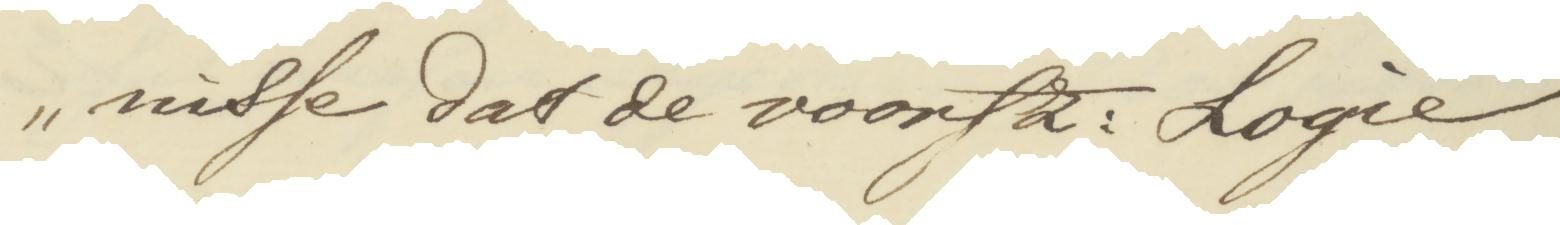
„nisse dat de voorsz: Logie
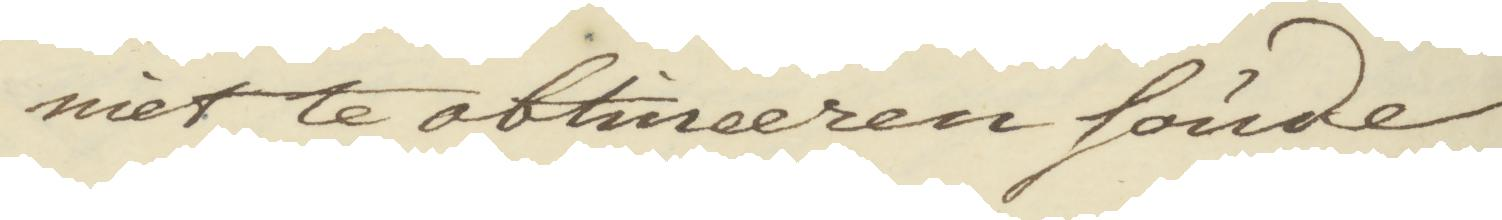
niet te obtineeren Soude
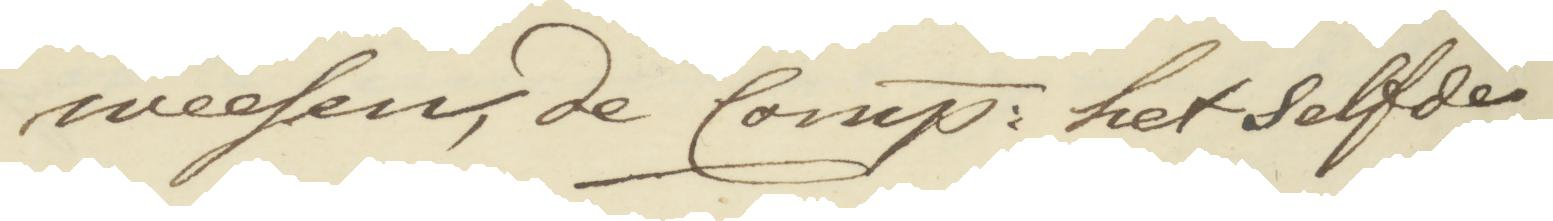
weesen, de Comp: het selfde
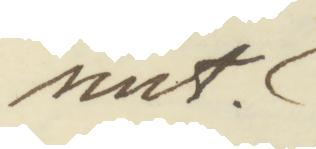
nut.
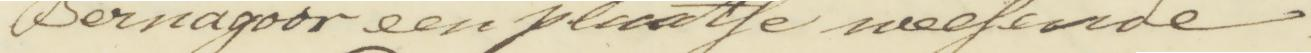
Bernagoor een plaatse weesende
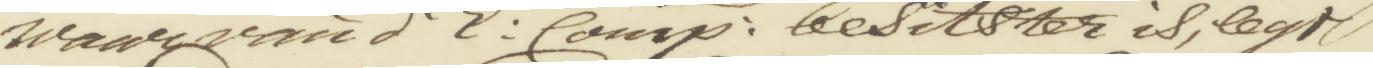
waar van d' E: Comp: besitster is, legt
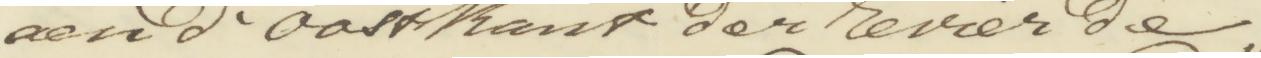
aen d’ oostkant der revier de
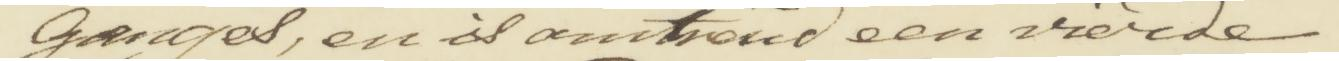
Ganges, en is omtrend een vierde
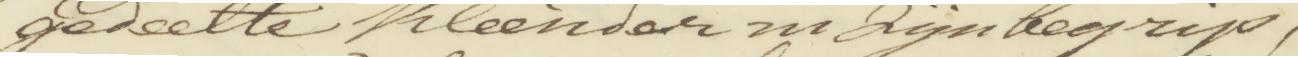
gedeelte Kleender in Zijn begrip,
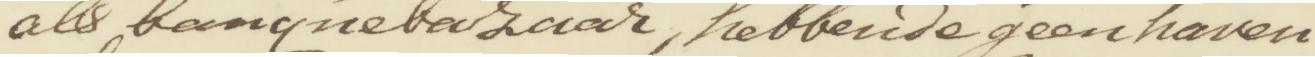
als banquebazaar, hebbende geen haven
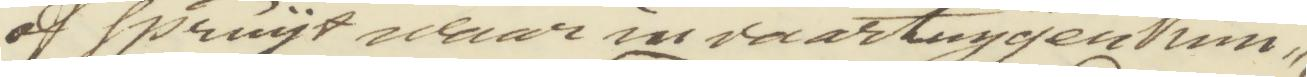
of Spruijt waar in vaartuijgen Kun„
